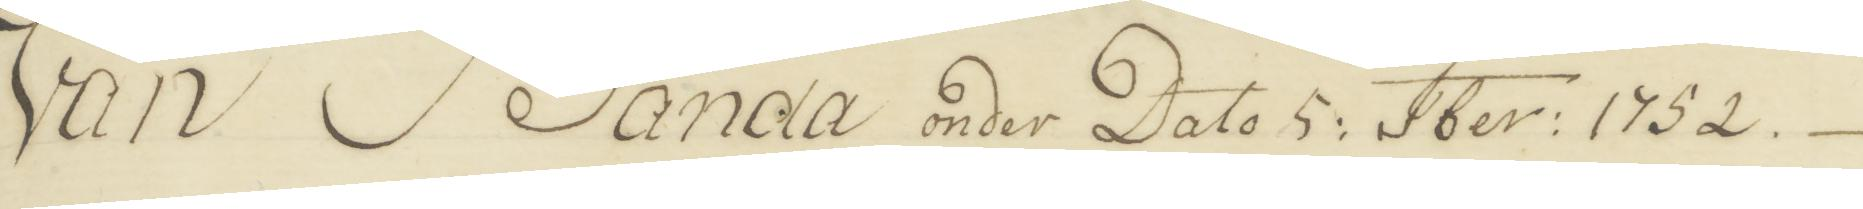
Van Banda onder Dato 5: Iber: 1752. —
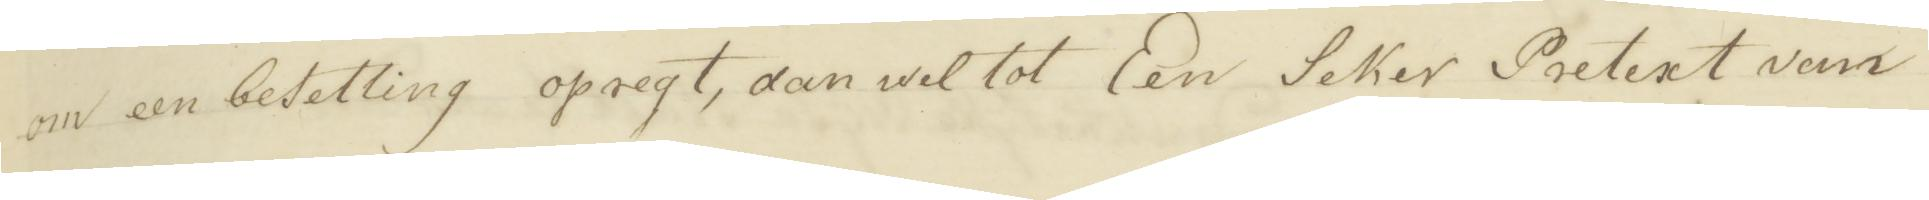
om een besetting opregt, dan wel tot Een seker Pretext van
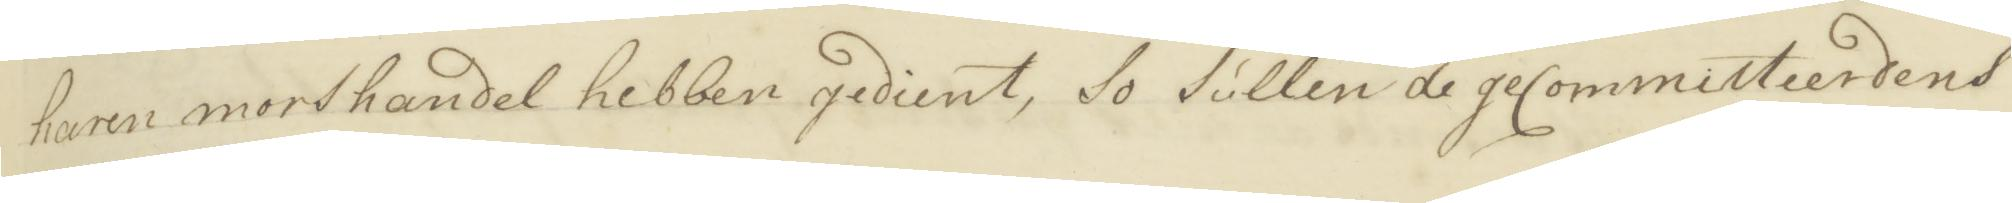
haren morshandel hebben gedient, so sullen de gecommitteerdens
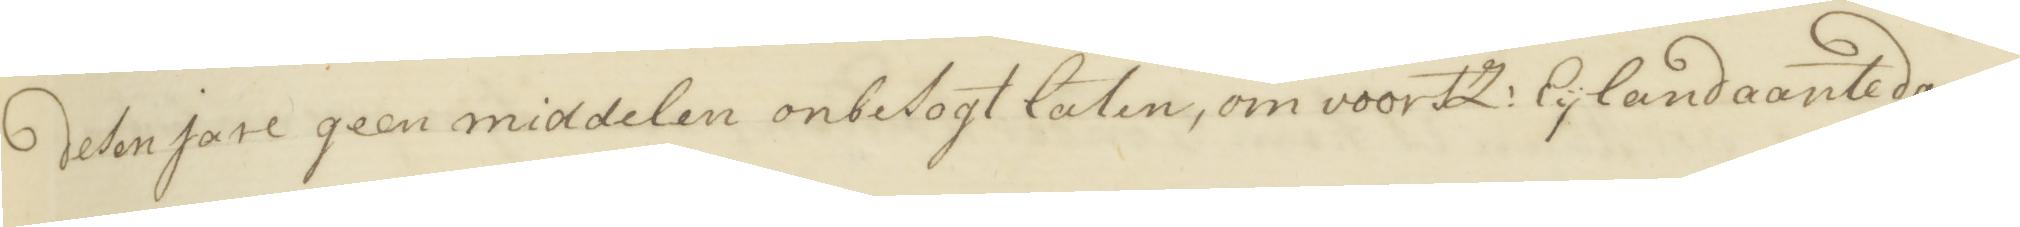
desen jare geen middelen onbesogt laten, om voorsz: Eijland aante doen
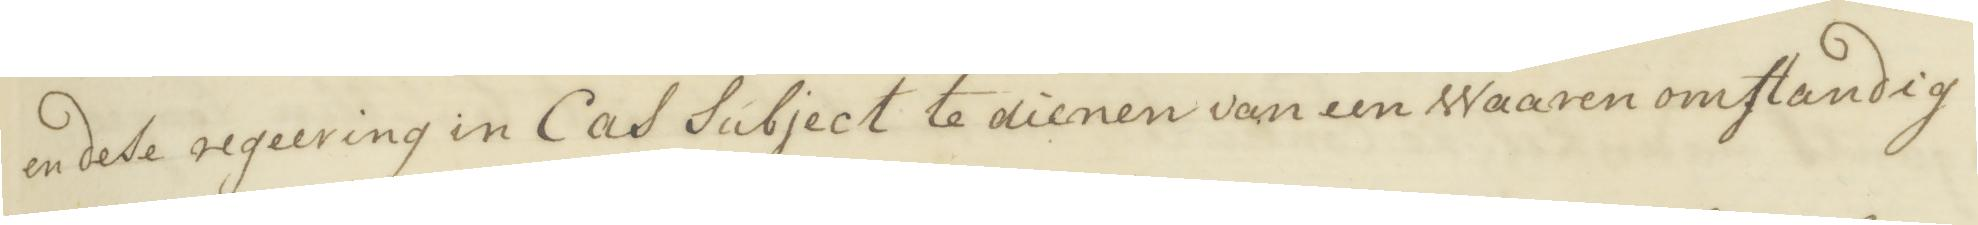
en dese regeeving in Cas subject te dienen van een waaren omstandig
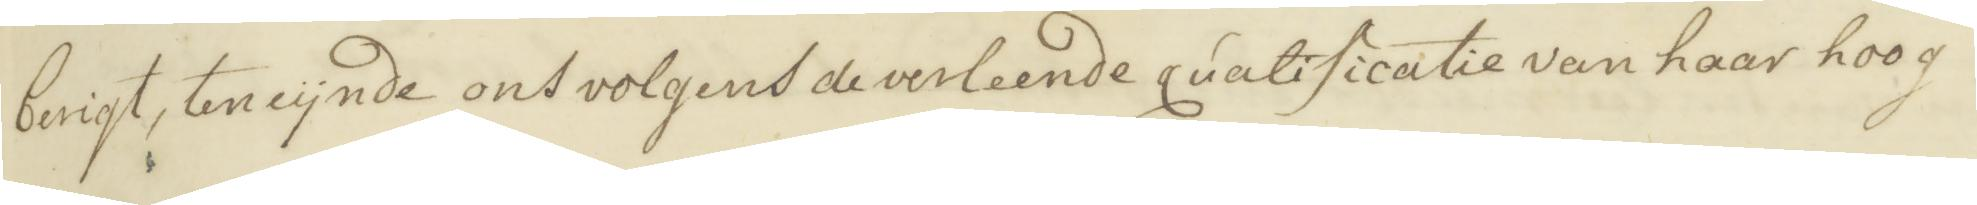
berigt, ten eijnde ons volgens de verleende qualificatie van haar hoog
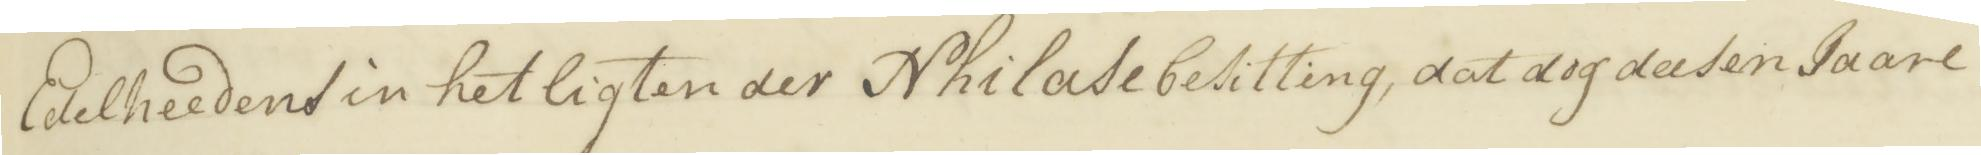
Edelheedens in het ligten der Nhilase besitting, dat dog deesen Iaare
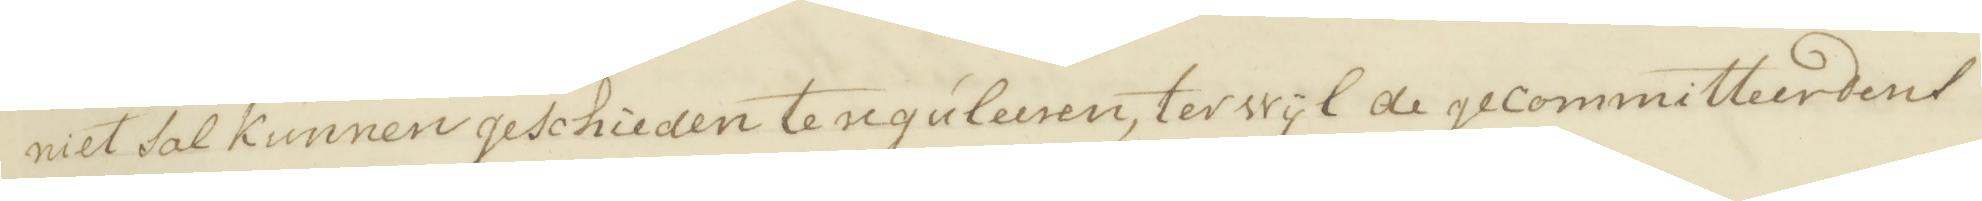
niet sal kunnen geschieden te reguleeren, terwijl de gecommitteerdens
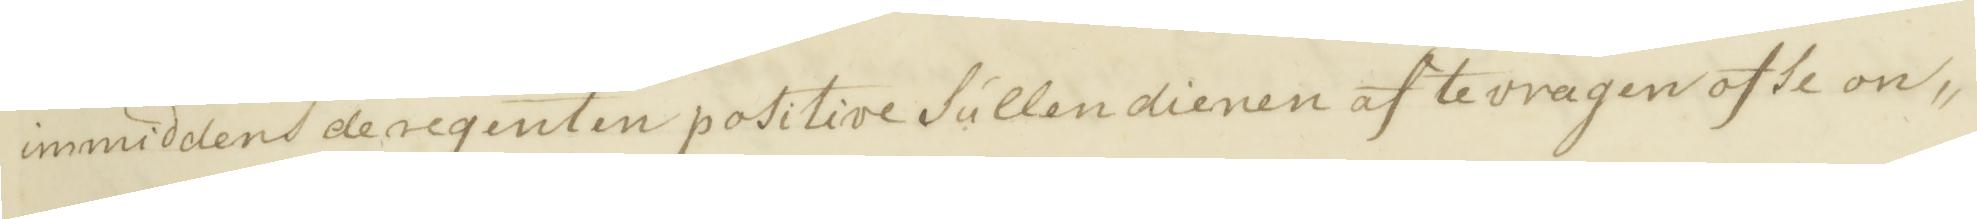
immiddens de regenten positive sullen dienen af te vragen ofse on„
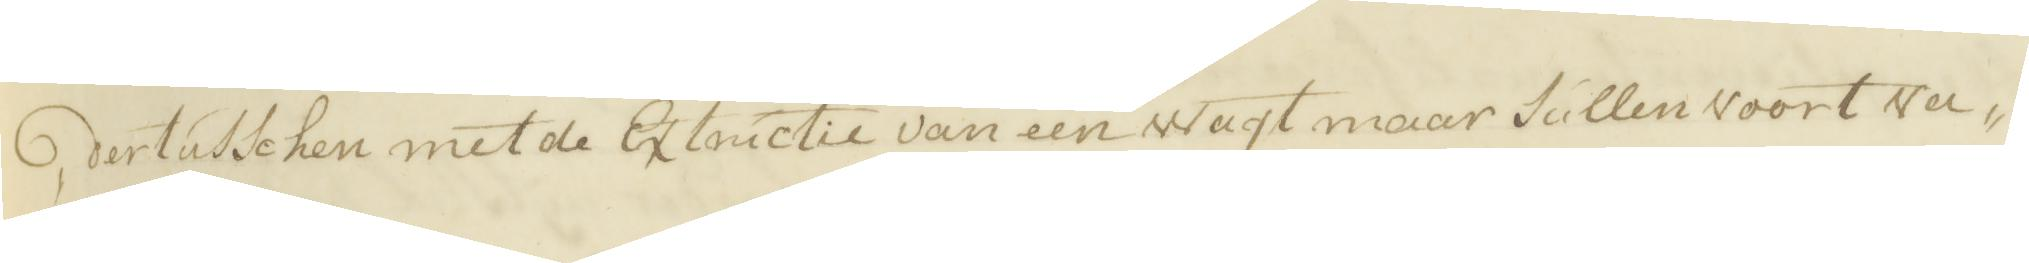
dertusschen met de Extructie van een wagt maar sullen voort va„
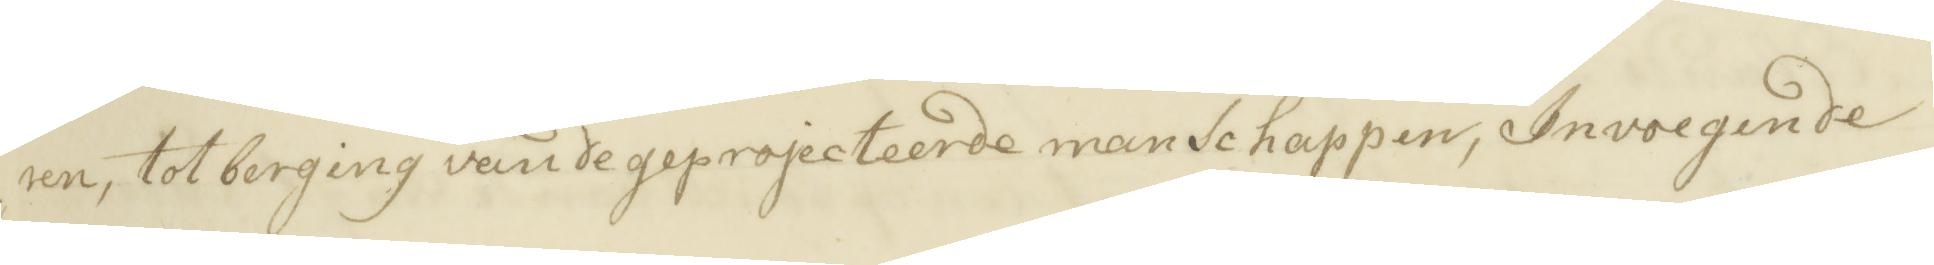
„ren, tot berging van de geprojecteerde manschappen, Invoegende
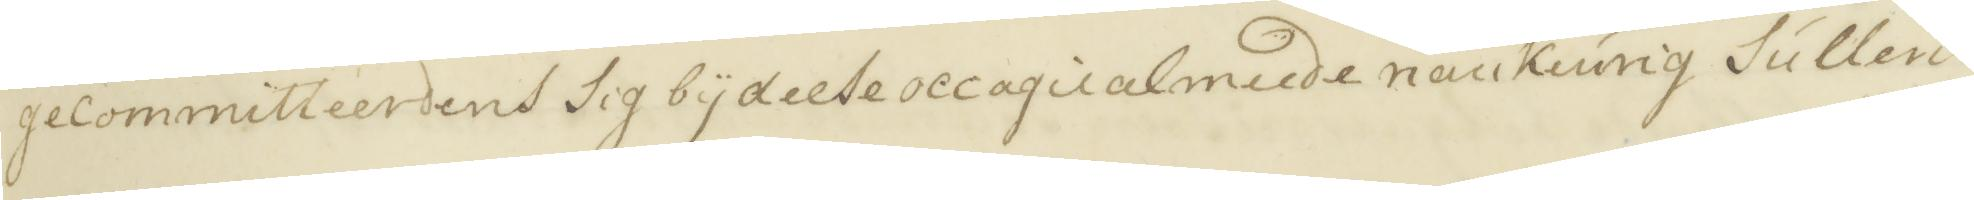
gecommitteerdens sig bij deese occagie almeede naukeurig sullen
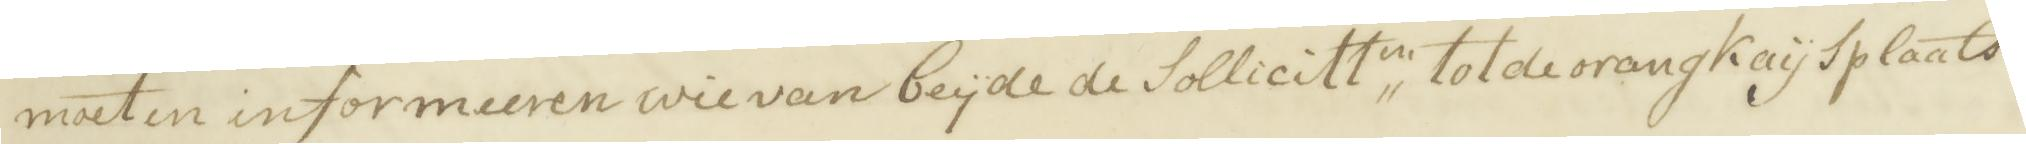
moeten informeeren wie van beijde de sollicitt„n tot de orangkaijsplaats
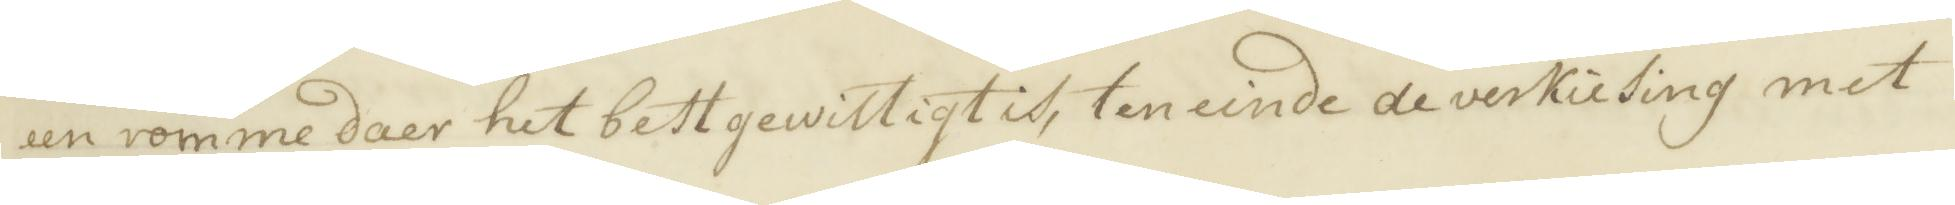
een romme daer het best gewittigt is, ten einde de verkiesing met
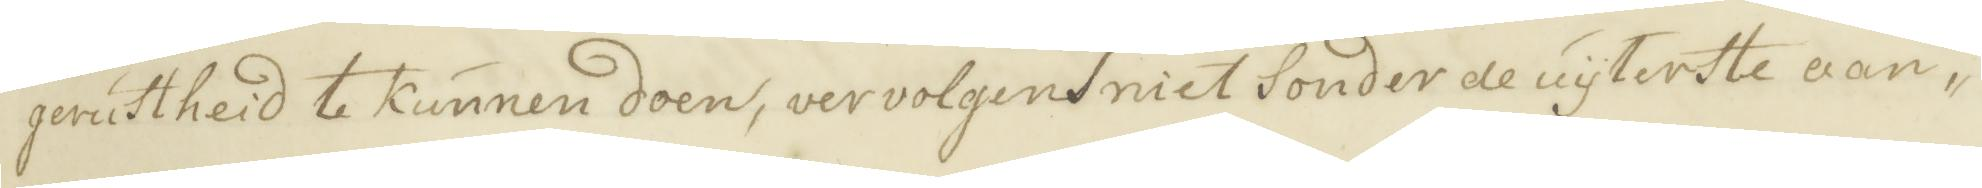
gerustheid te kunnen doen, vervolgens niet sonder de uijterste aan„
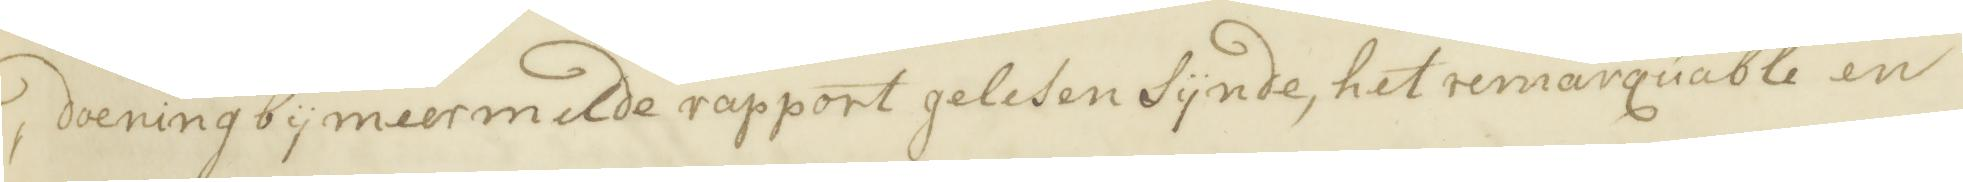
„doening bij meermelde rapport gelesen sijnde, het remarquable en
